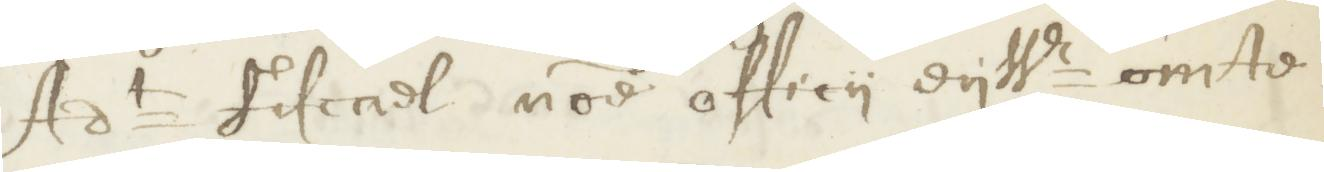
Ad=t fiscael noe afficij eijs=r om te
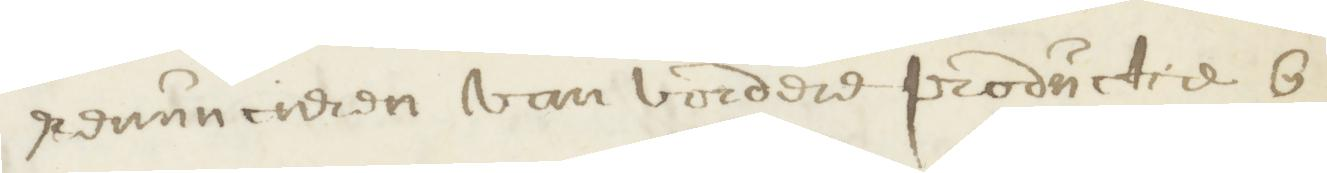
renuncieren van vordere productie ende
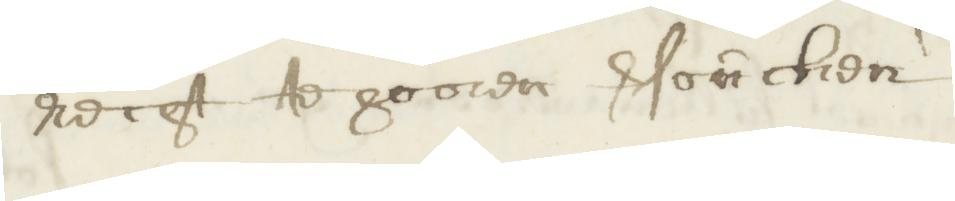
recht te gaaren versoucken
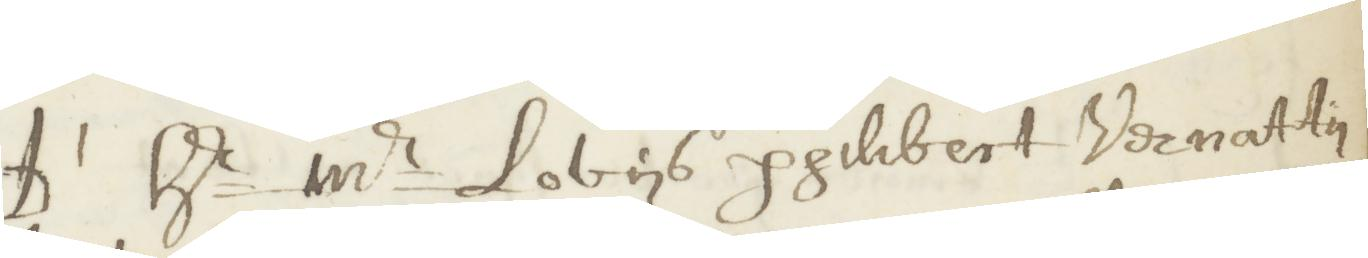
D' h=r m=r Lovijs philibert Vernattij
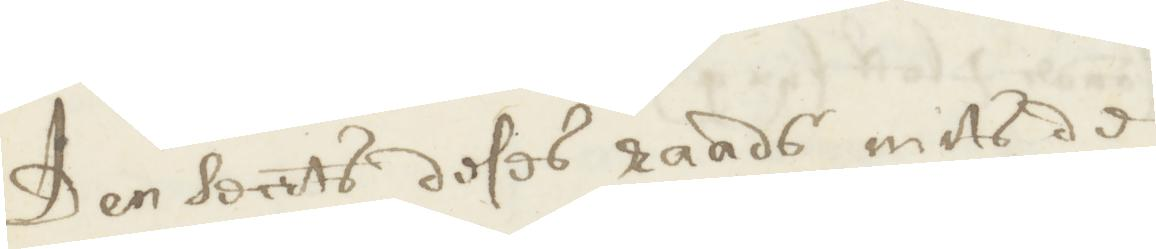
Den sents deses raads mits de
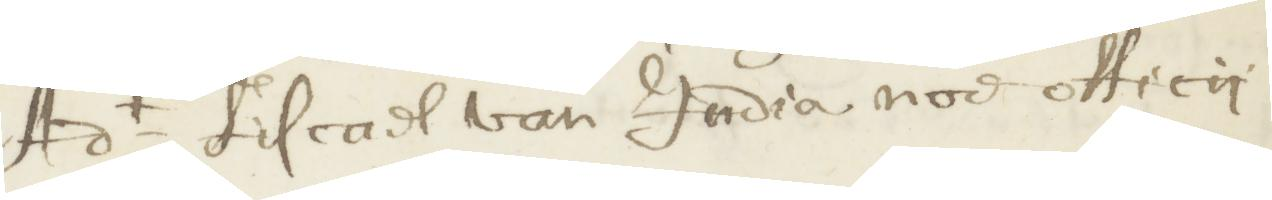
Ad=t fiscael van Jndia noe officij
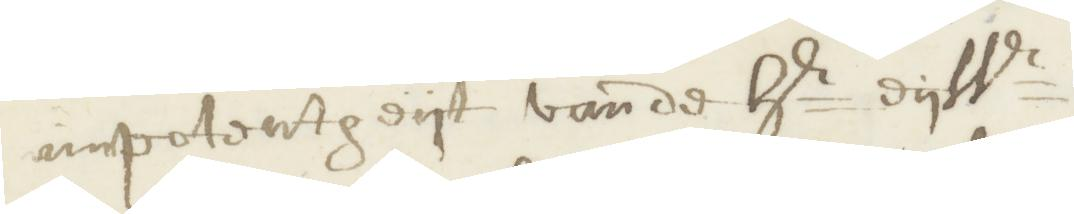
impotentheijt van de h=r eijss=r
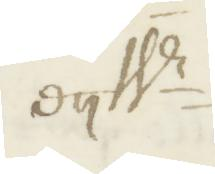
eyss=r
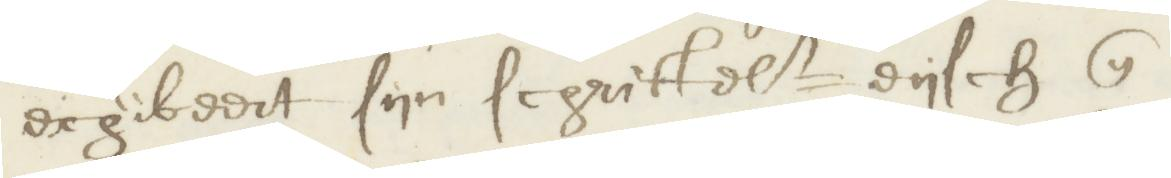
exhibeert sijn schriftelijk eijsch ende
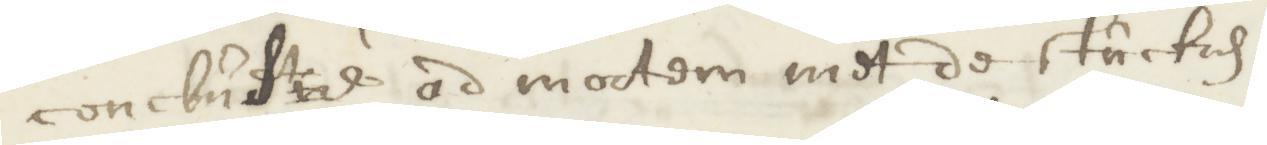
conclusie ad mortem met de stucken
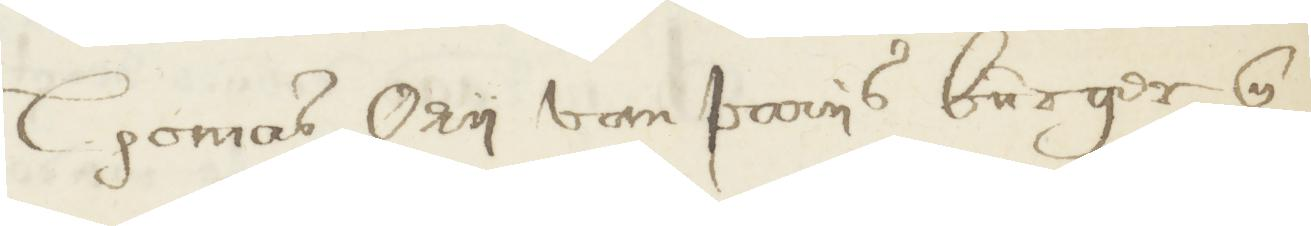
Thomas Orij van parijs burgers
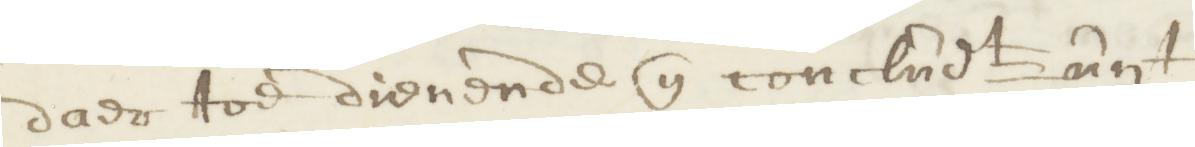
daer toe dienende ende conclud=t uyt
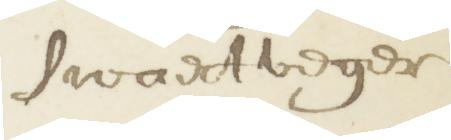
swaertveger
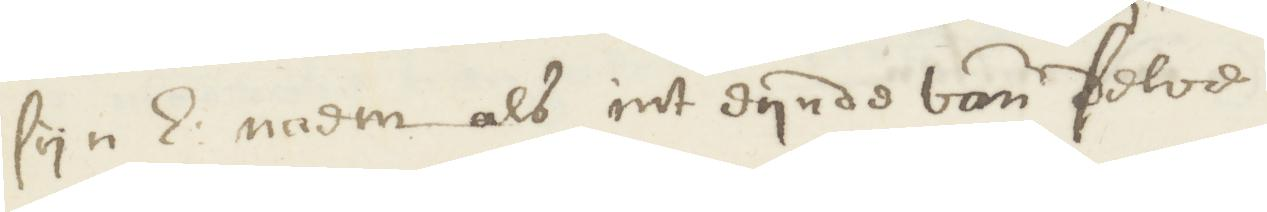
sijn E: naem als int eynde van selve
